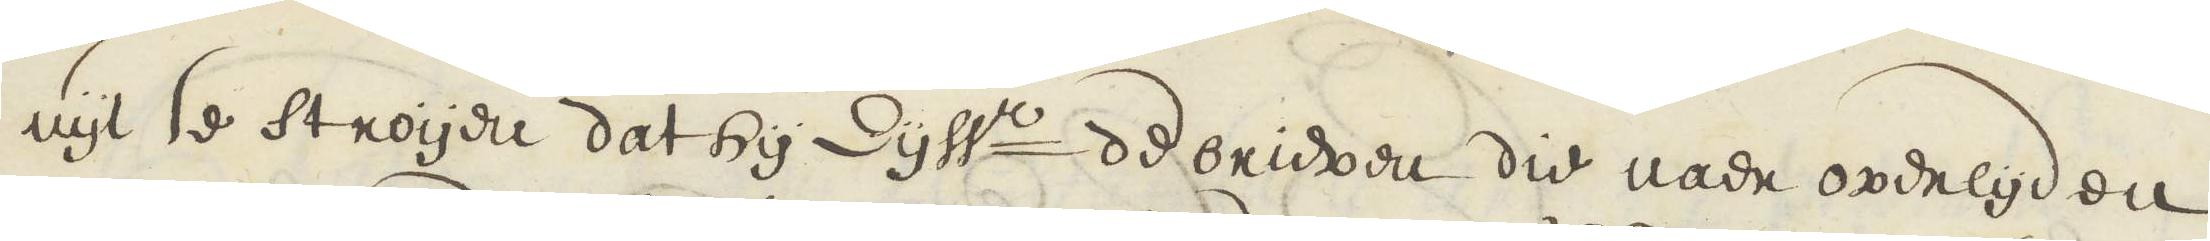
uijt te stroijen dat hij Eijss=r de brieven die naer overlijden
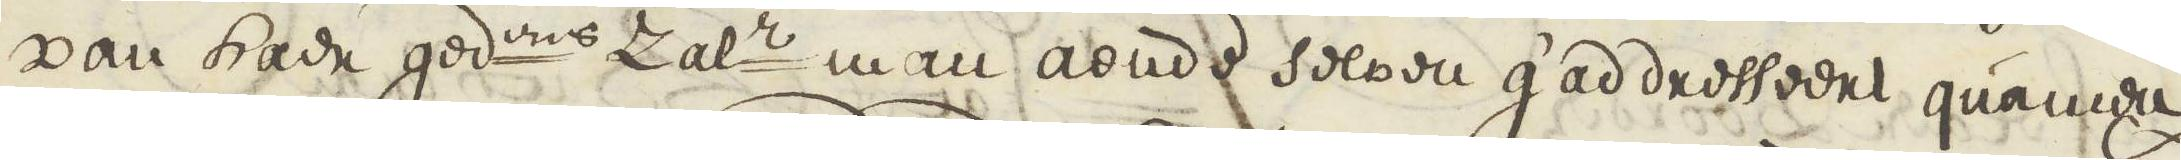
van haer ged=ens zal=r man aende selven g’addresseert quamen
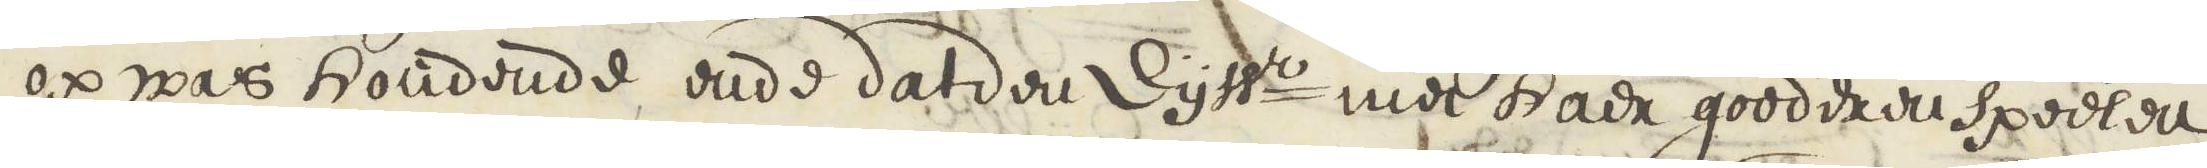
op was houdende ende dat den Eijss=r met haer goederen speelen
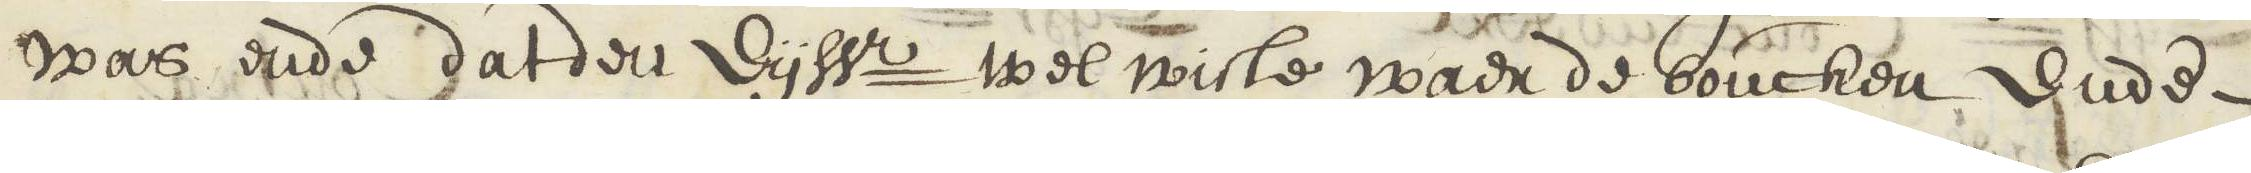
was ende dat den Eijss=r wel wiste waer de boucken Ende
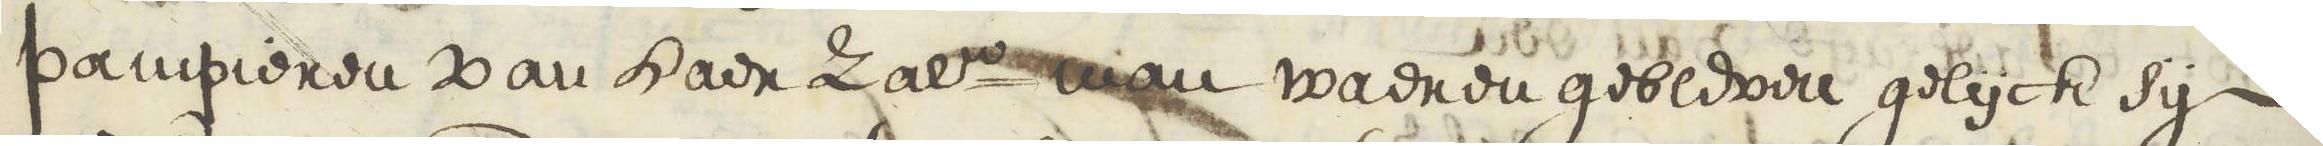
pampieren van haer zal=r man waeren gebleven gelijck sij
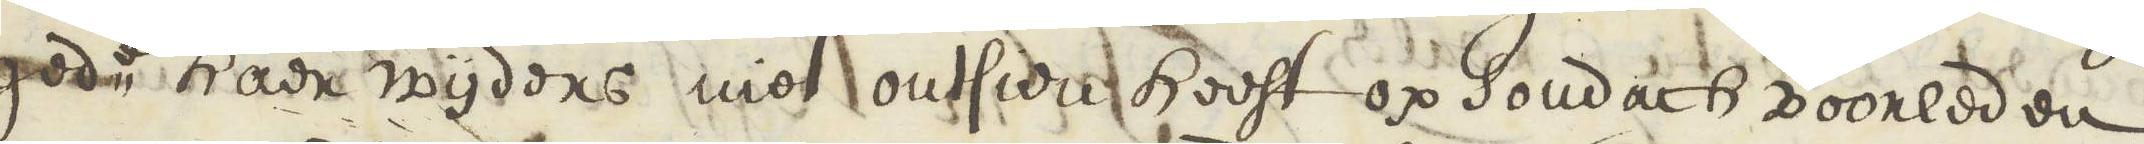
ged„e haer wijders niet ontsien heeft op sondach voorleden
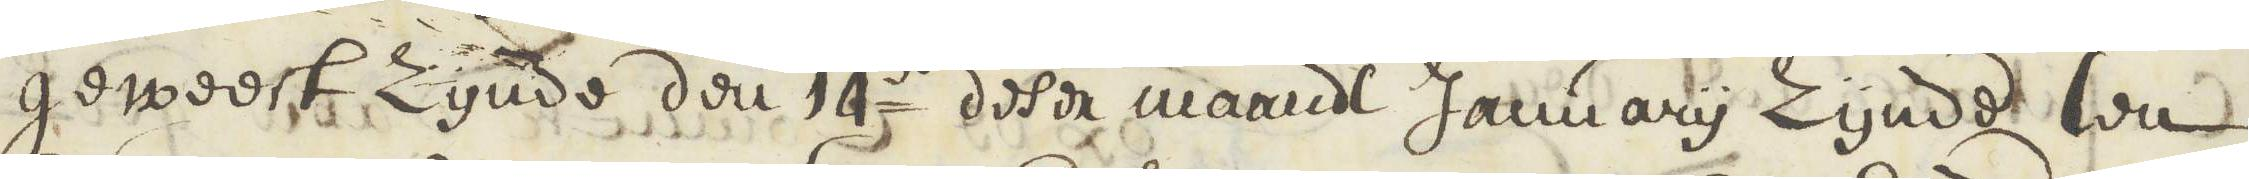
geweest zijnde den 14=e deser maandt Januarij zijnde ten
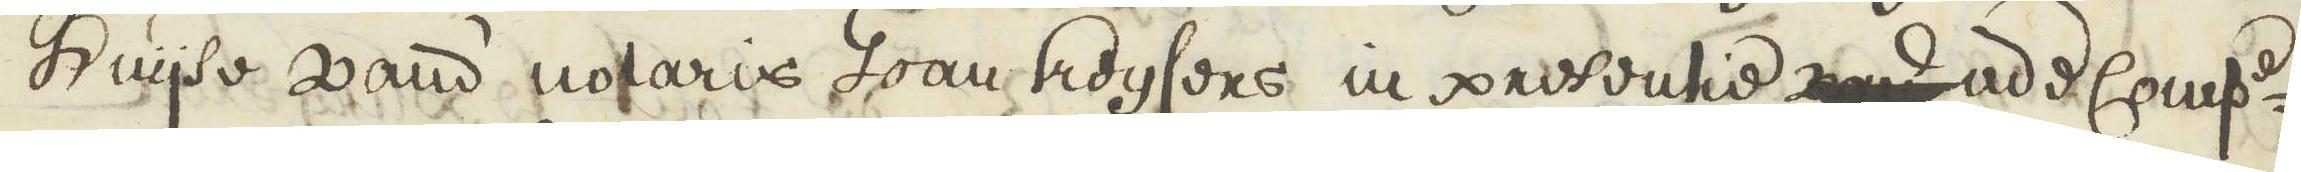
huijse vand' notaris Joan keysers in presentie nde Comp=e
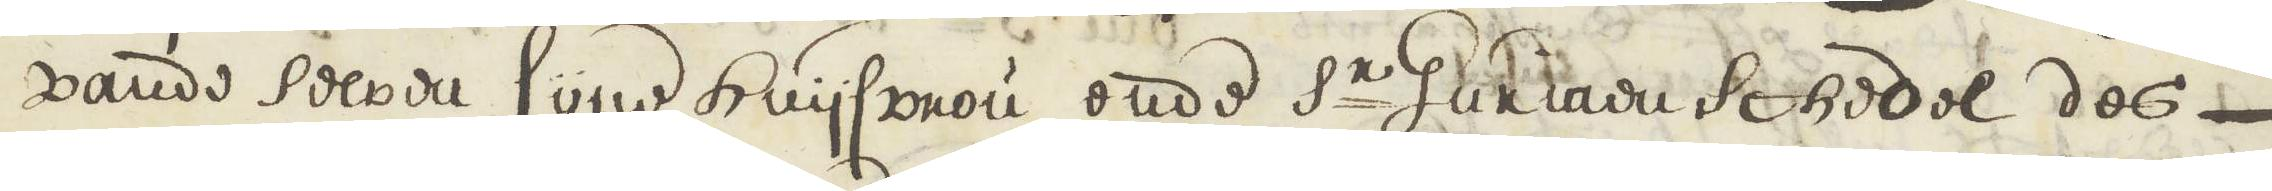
vande selven sijne Huijsvrou ende s=r Juriaen schedel des —
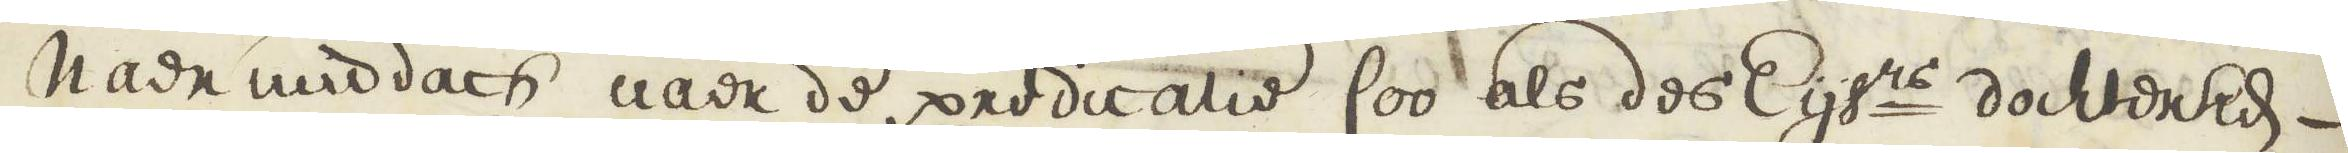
naer middach naer de predicatie soo als des Eijs=rs dochterken —
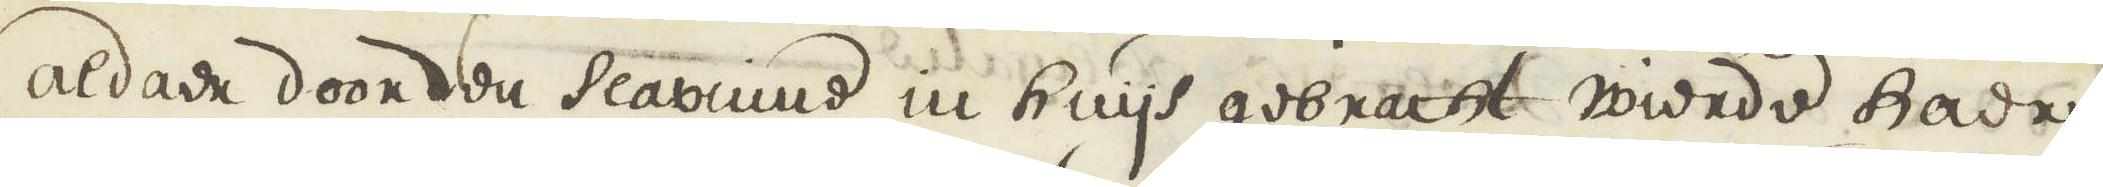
aldaer door den slavinne in huijs gebracht wierde haer
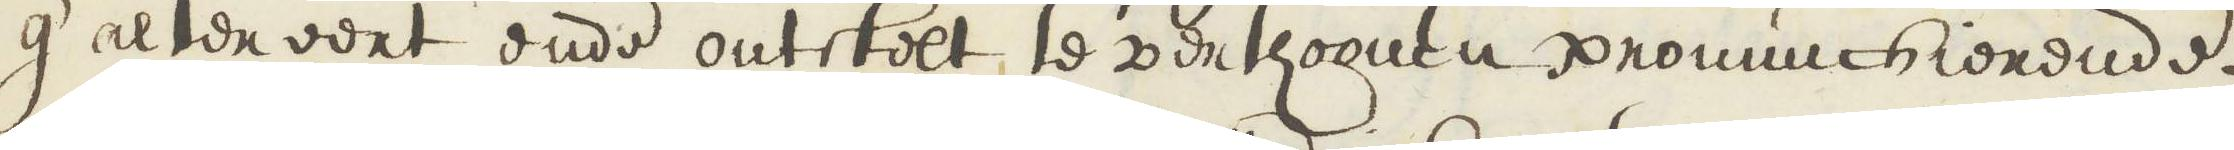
g’altereert ende ontstelt te verthoonen pronunchierende
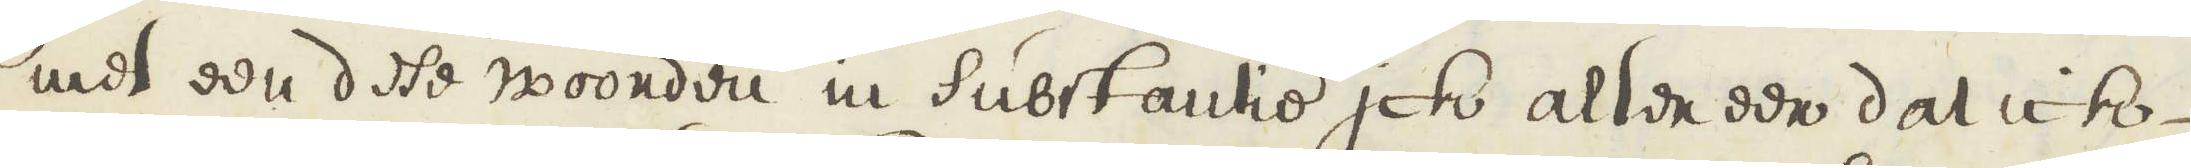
met een dese woorden in substantie jck alter eer dat ick-
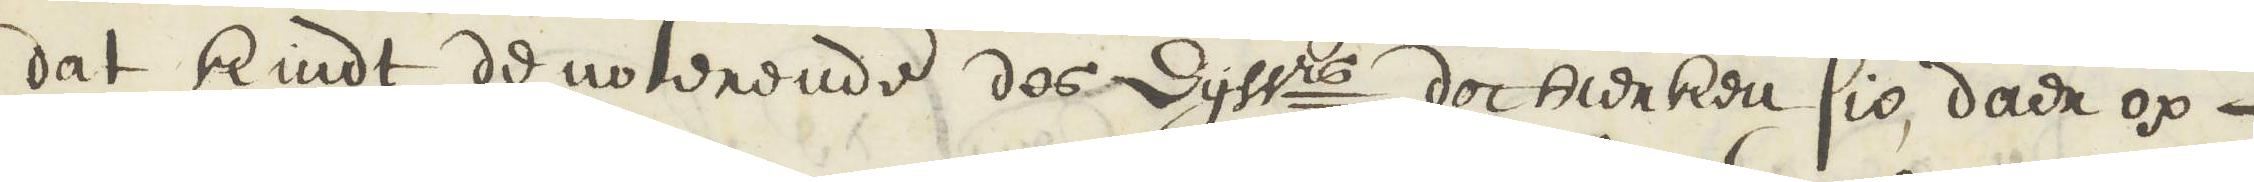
dat kindt de noterende des Eijss=rs dochterken sie, daer op -
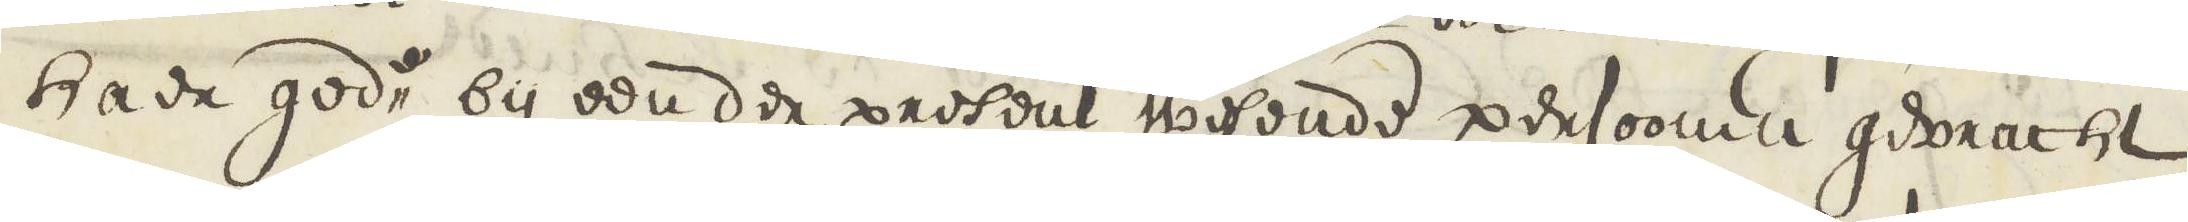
haer ged„e bij een der present wesende persoonen gevracht
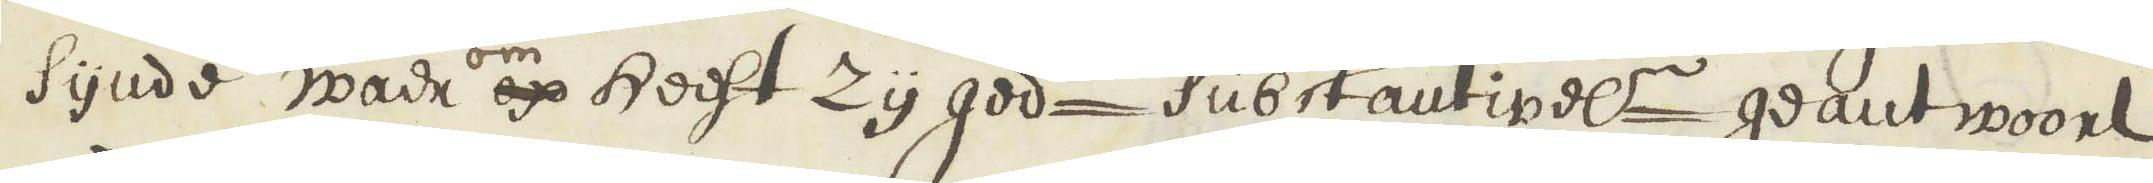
sijnde waer om op heeft zij ged=e substantivel= geantwoort
